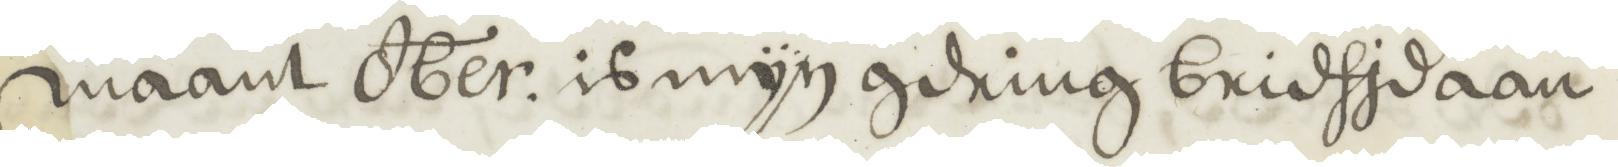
maant 8ber. is mijn gering briefje aan
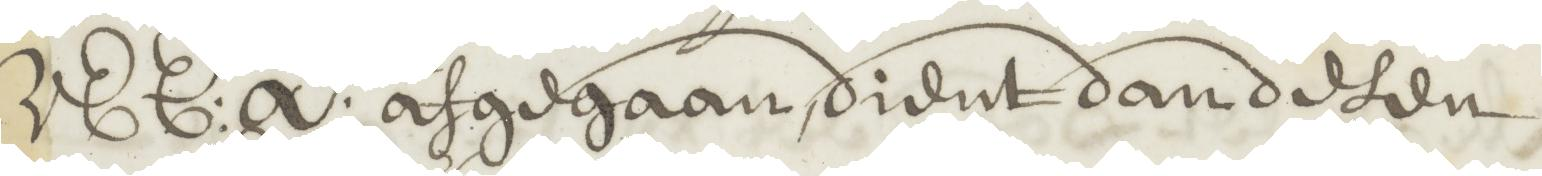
VEE: a: afgegaan, dient dan desen
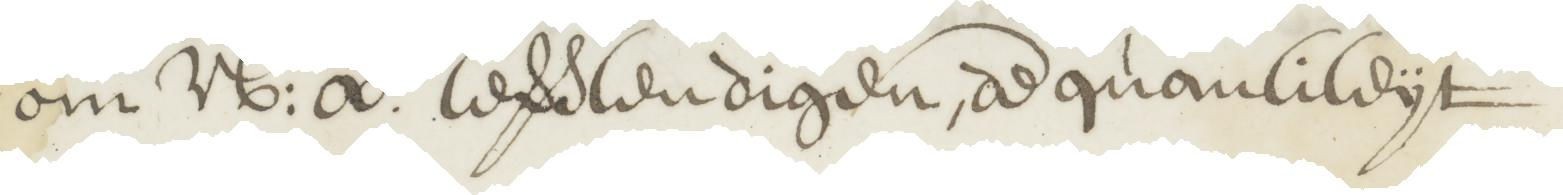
om VE: a: te verstendigen, de quantiteijt
